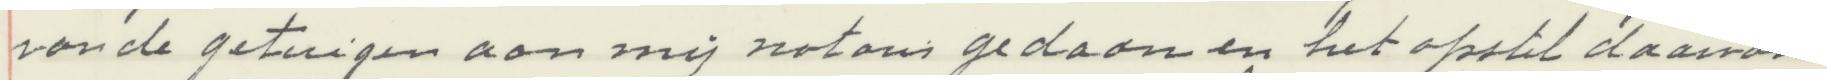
van de getuigen aan mij notaris gedaan en het opstel daarom
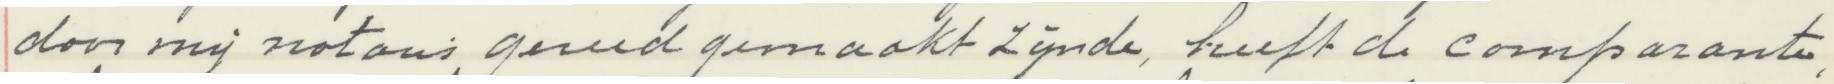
door mij notaris gereed gemaakt zijnde, heeft de comparante
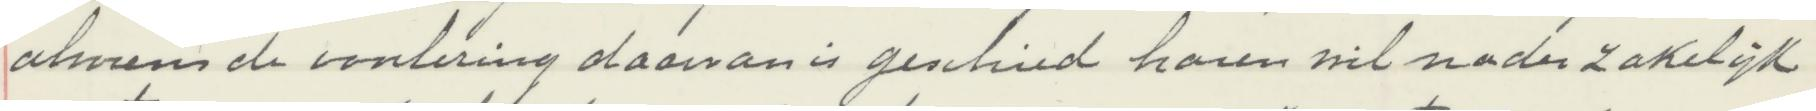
alvorens de voorlezing daarvan is geschied haren wil nader zakelijk
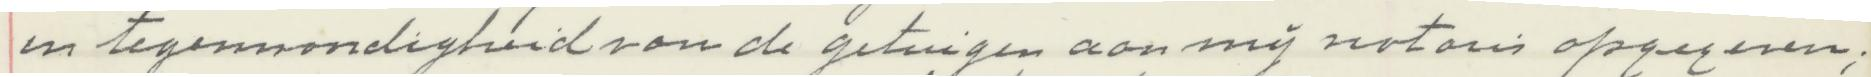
in tegenwoordigheid van de getuigen aan mij notaris opgegeven;
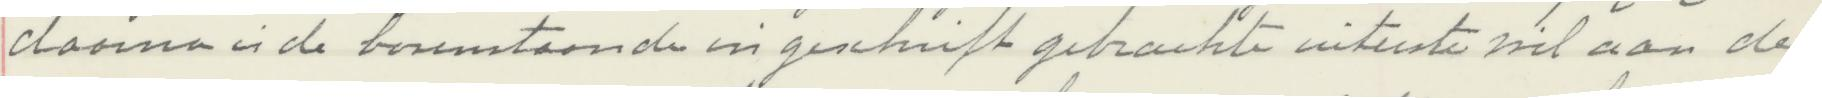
daarna is de bovenstaande in geschrift gebrachte uiterste wil aan de
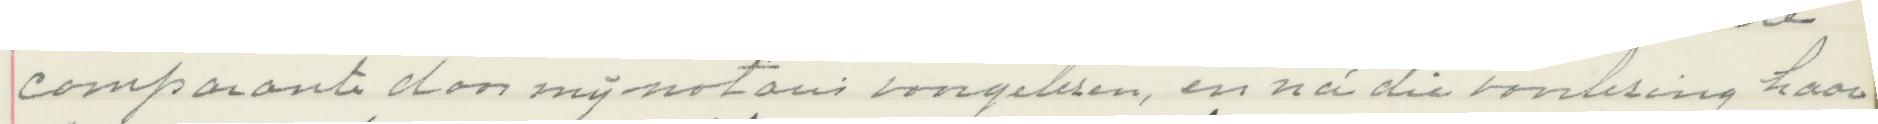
comparante door mij notaris voorgelezen, en na die voorlezing haar
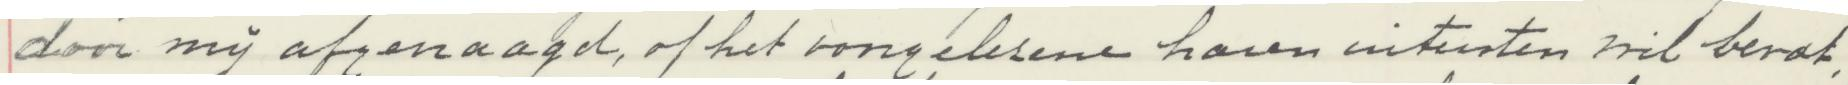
door mij afgevraagd, of het voorgelezene haren uitersten wil bevat
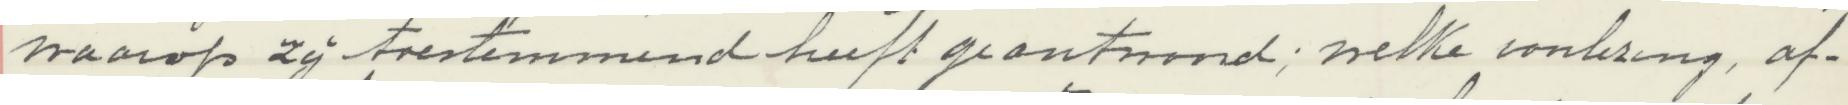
waarop zij toestemmend heeft geantwoord; welke voorlezing, af-
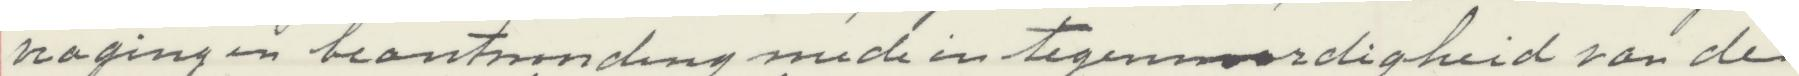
vraging en beantwoording mede in tegenwoordigheid van de
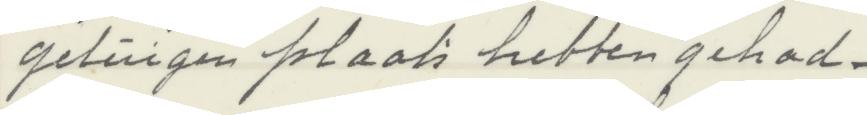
getuigen plaats hebben gehad
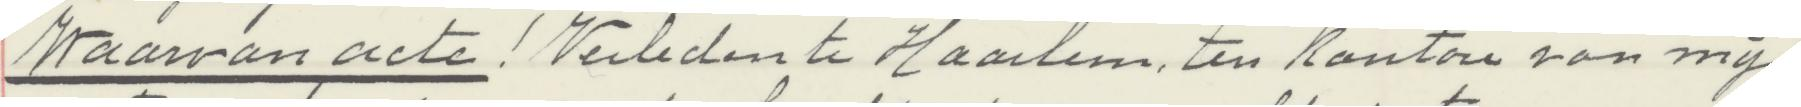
Waarvan acte! Verleden te Haarlem, ten kantore van mij
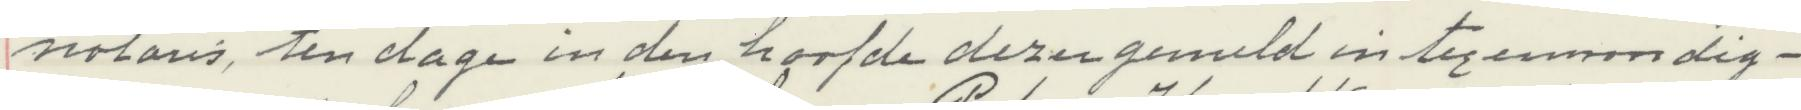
notaris, ten dage in den hoofde dezer gemeld in tegenwoordig-
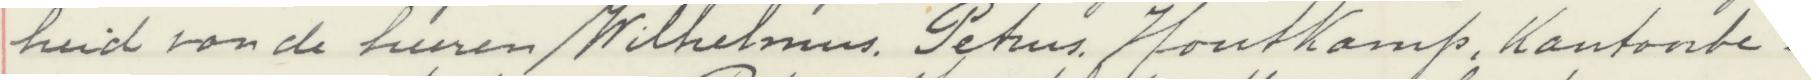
heid van de heeren Wilhelmus, Petrus, Houtkamp, Kantoorbe-
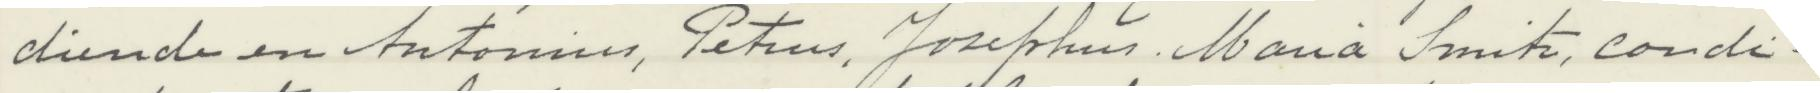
diende en Antonius, Petrus, Josephus. Maria Smitz, candi-
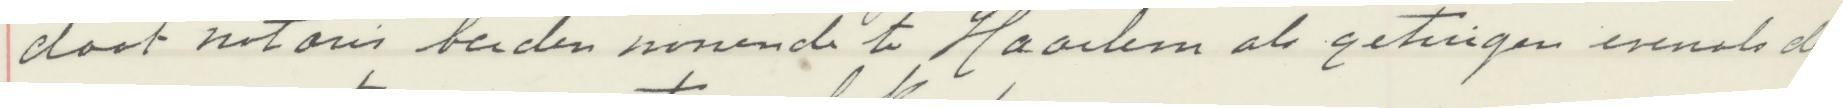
daat notaris beiden wonende te Haarlem als getuigen evenals de
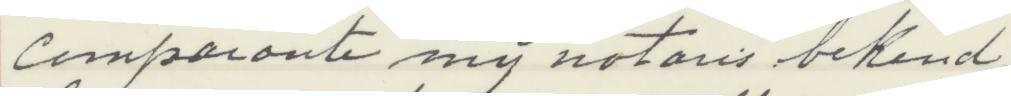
comparante mij notaris bekend
